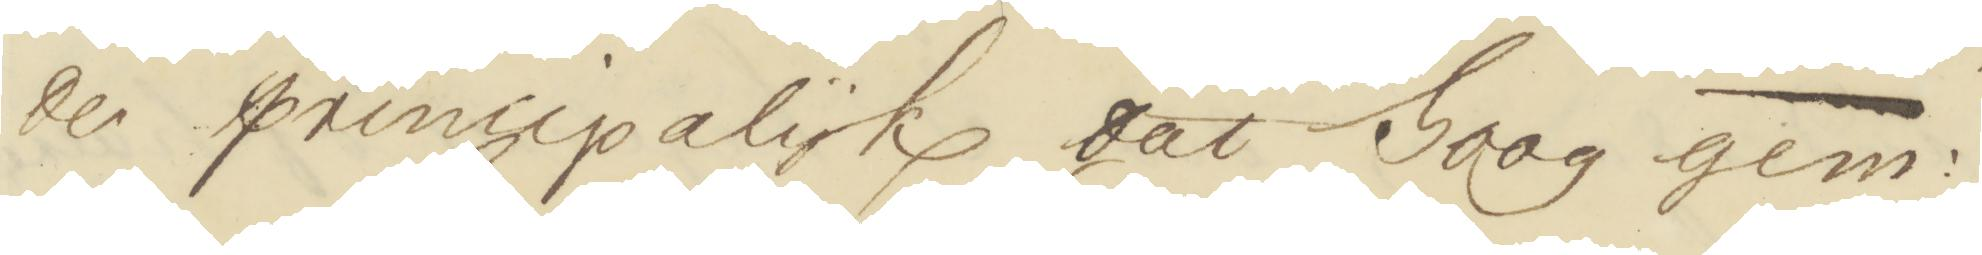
de principalijk dat hoog gem:
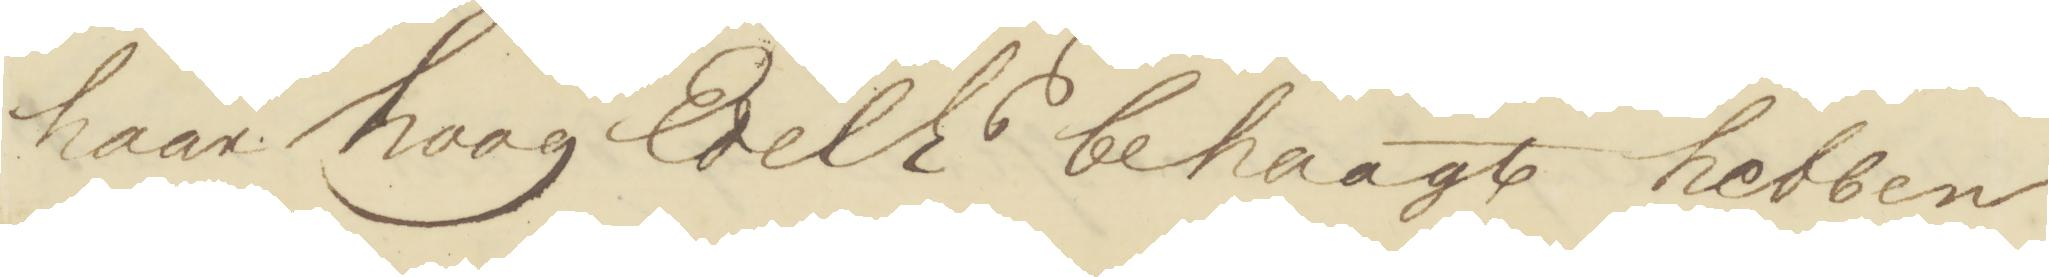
haar hoog Edelhs behaagt hebben
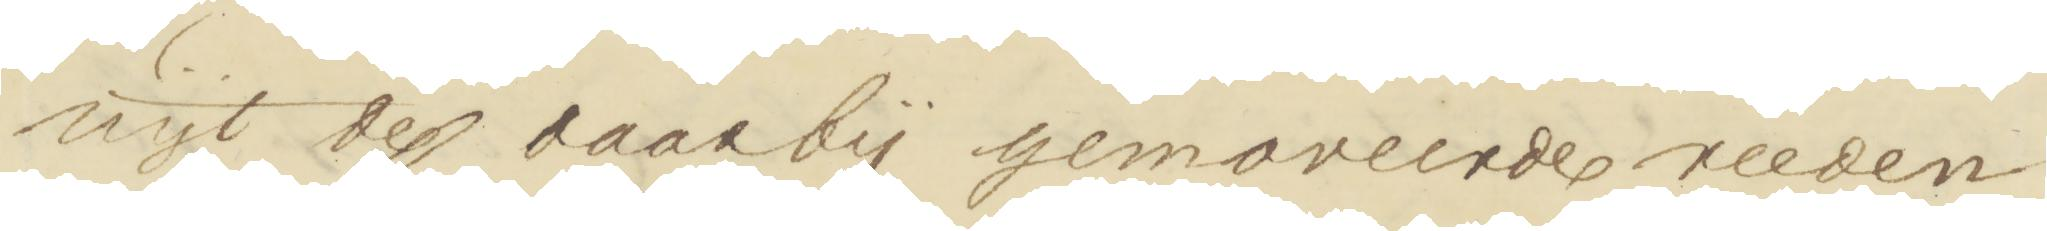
uijt de daar bij gemoveerde reeden
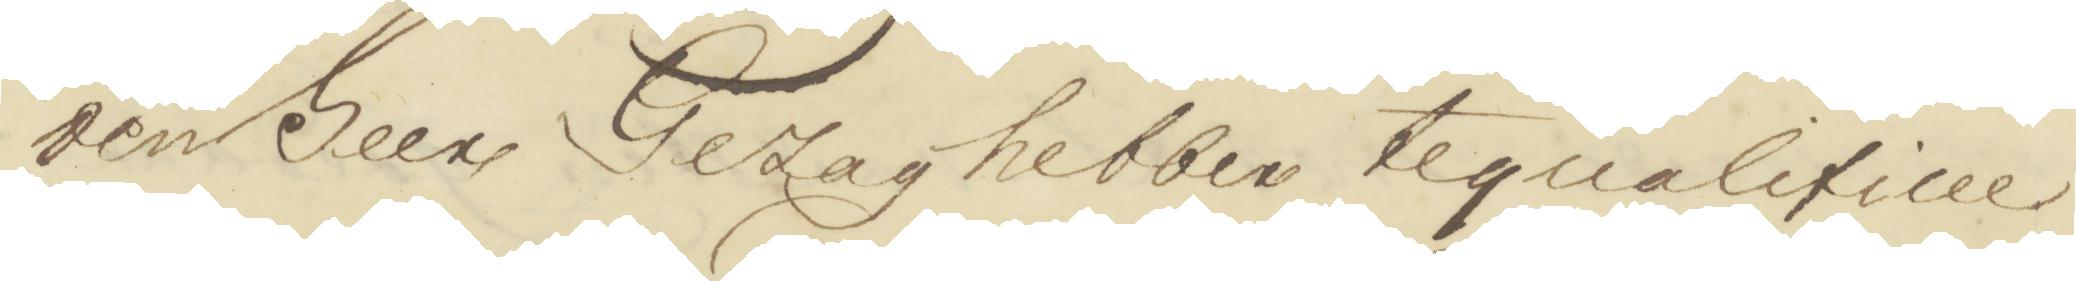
den heer Gezaghebber tequalificee
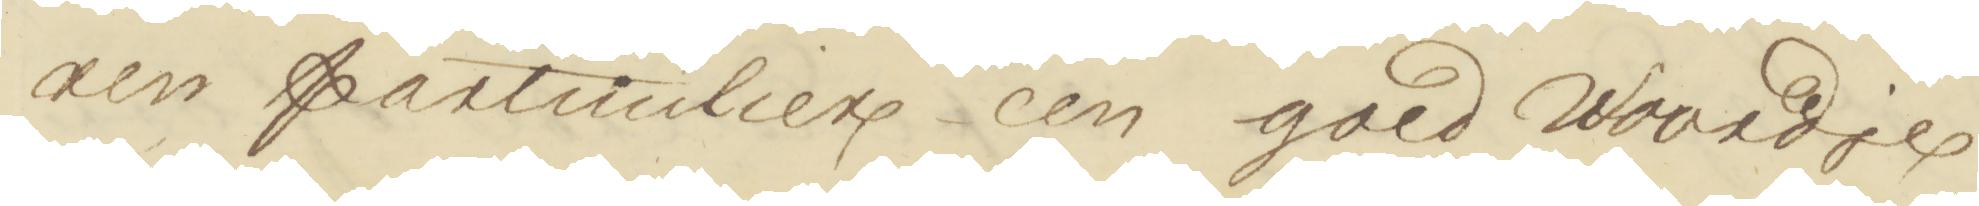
ren particulier een goed woordje
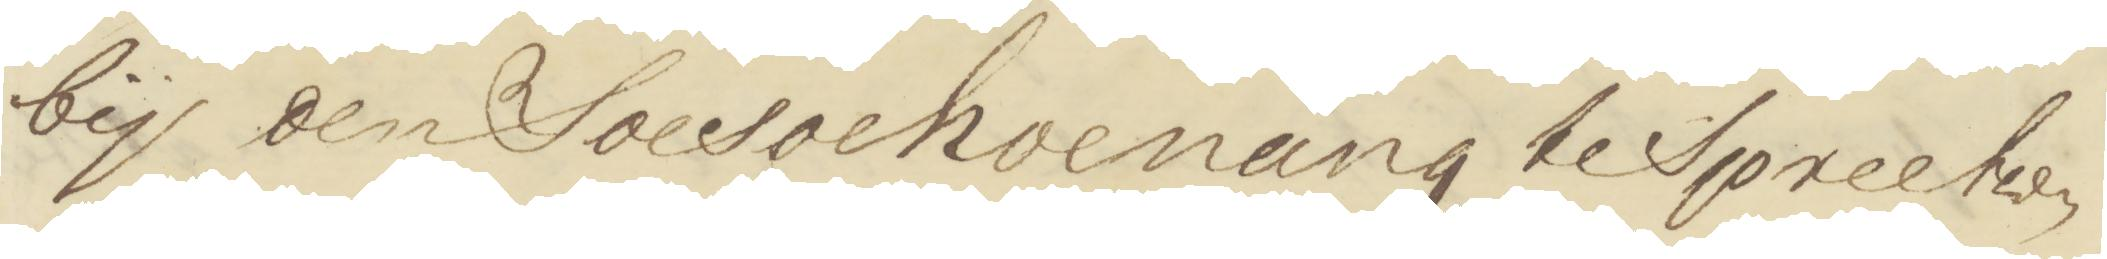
bij den soesoehoenang te spreeken
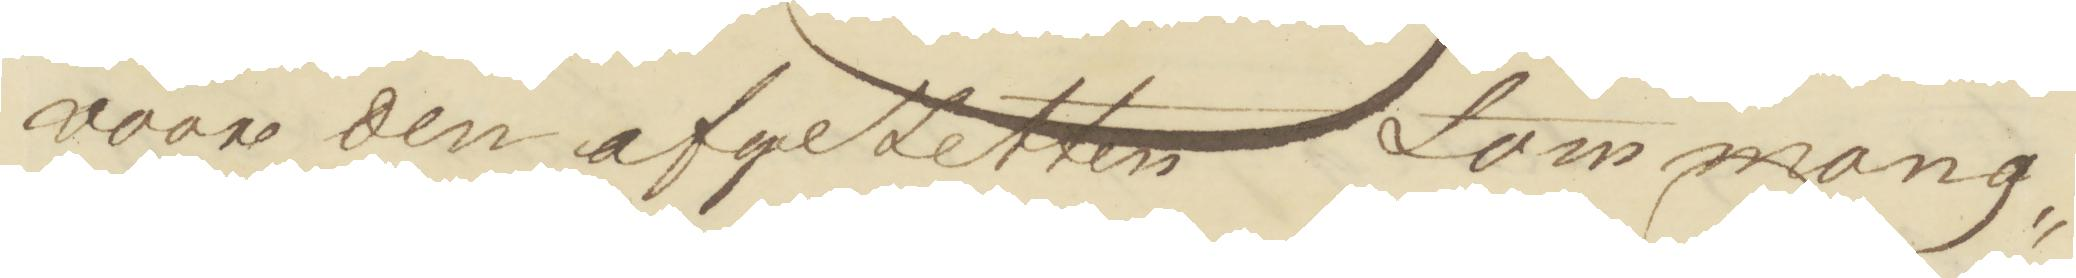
voor den afgezetten tommang„
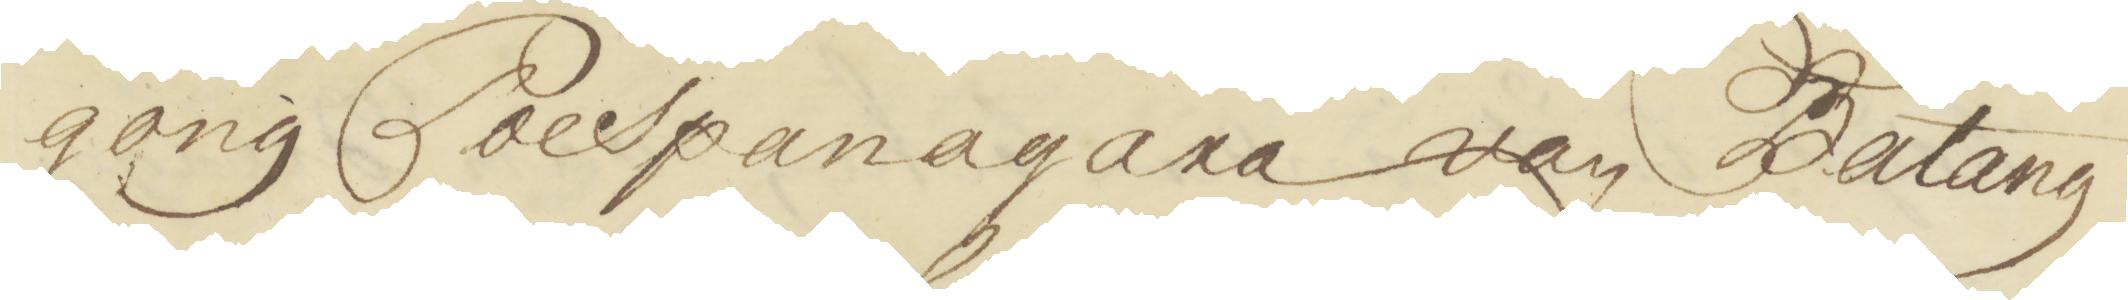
gong Poespanagara van Batang
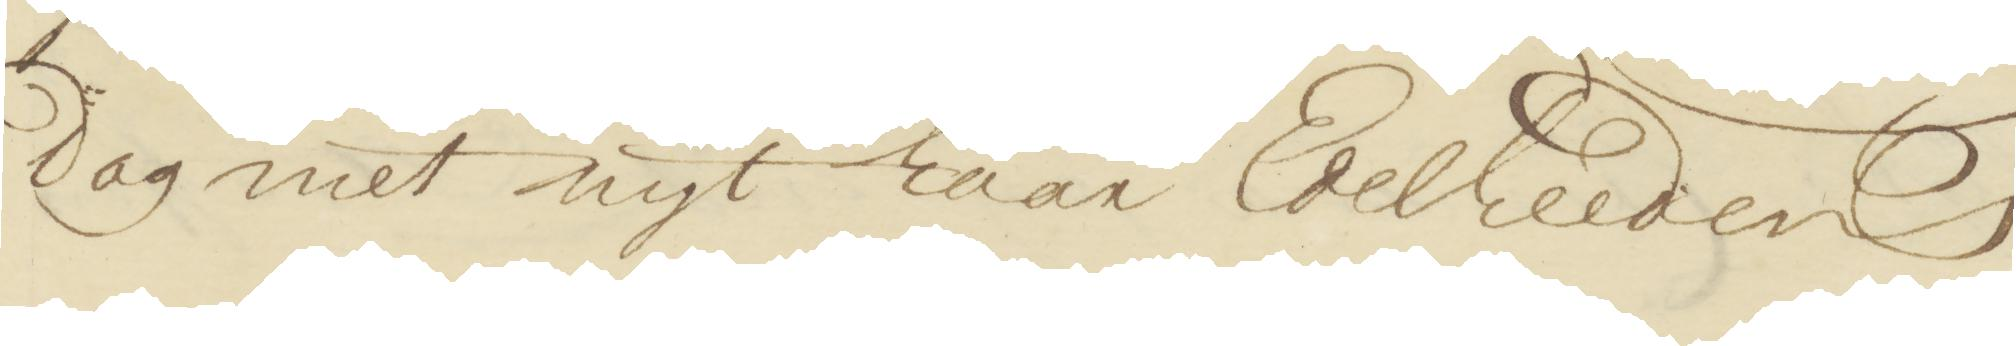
dog niet uijt haar Edelheedens
